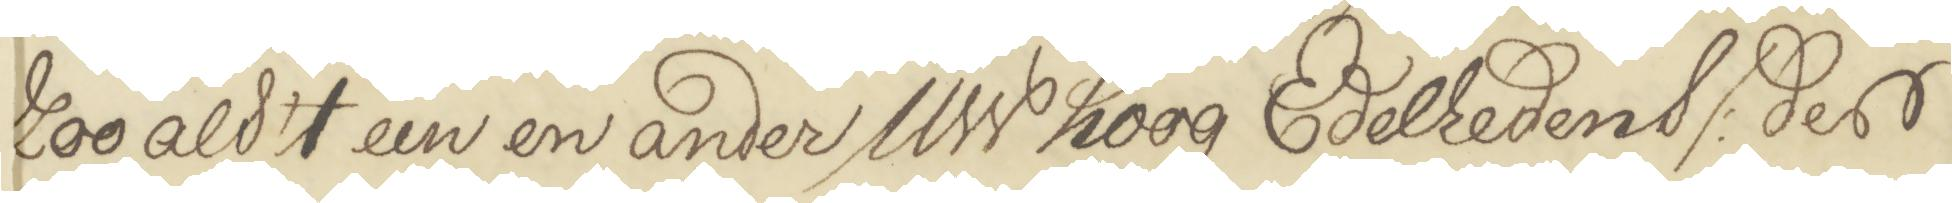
Zoo als 't een en ander UW hoog Edelhedens /:dess
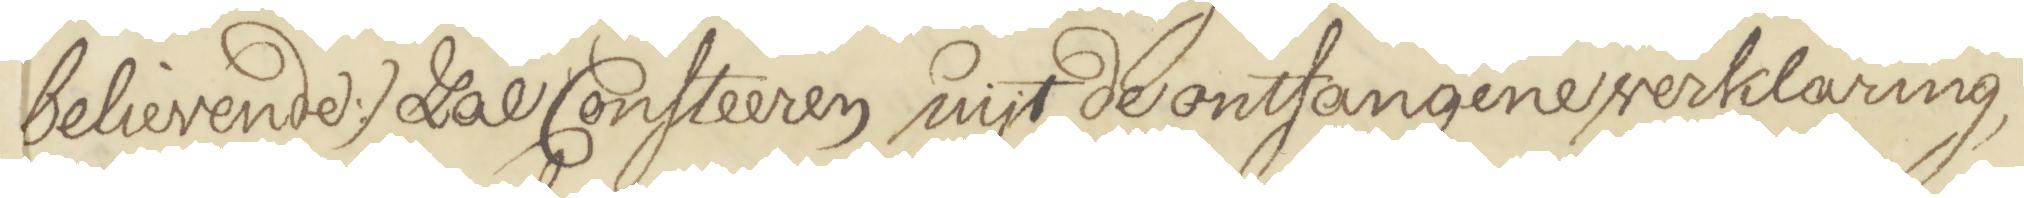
believende:) Zal Consteeren uijt de ontfangene verklaring,
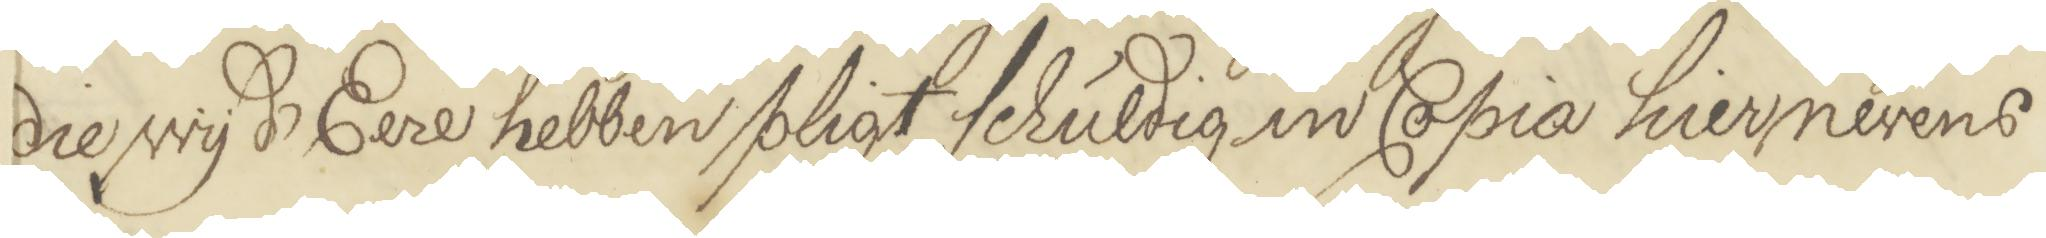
die wij d’ Eere hebben pligt Schuldig in Copia hier nevens
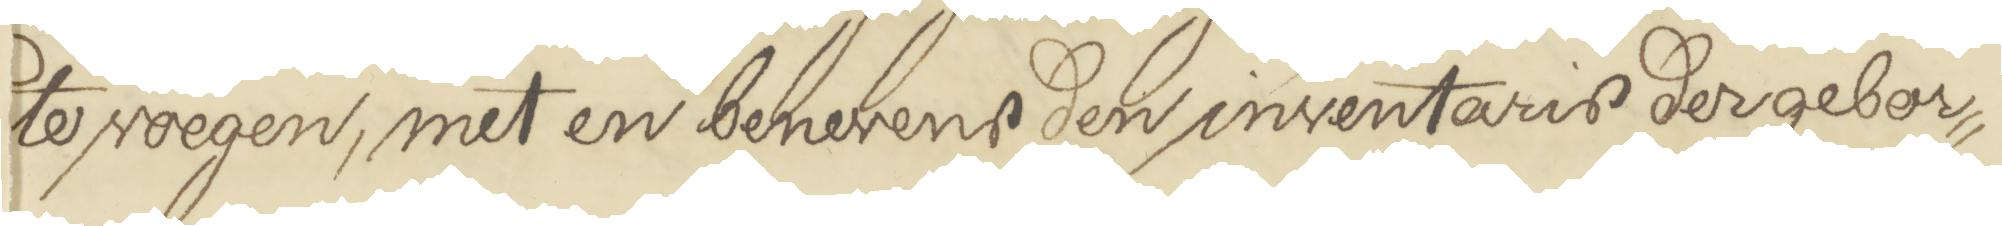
te voegen, met en benevens den inventaris der gebor„
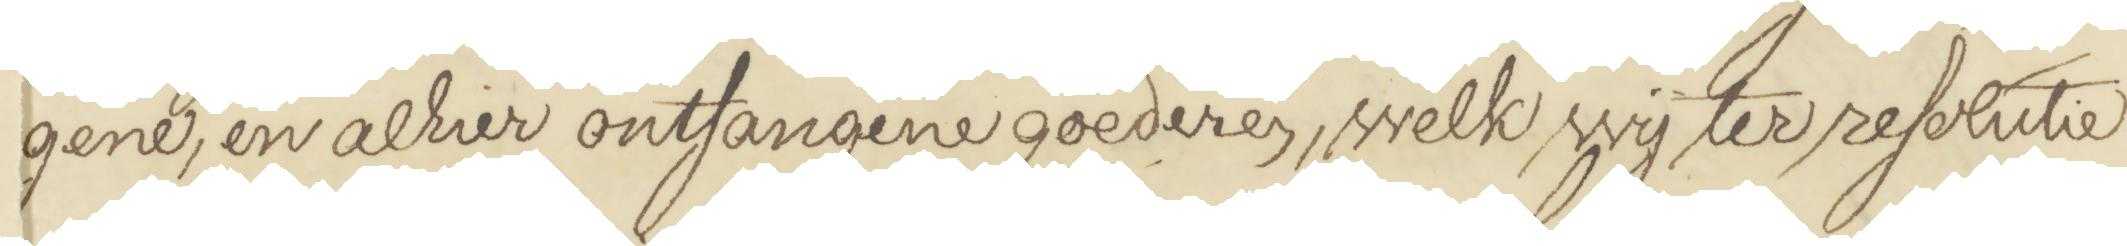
gene, en alhier ontfangene goederen, welk wij ter resolutie
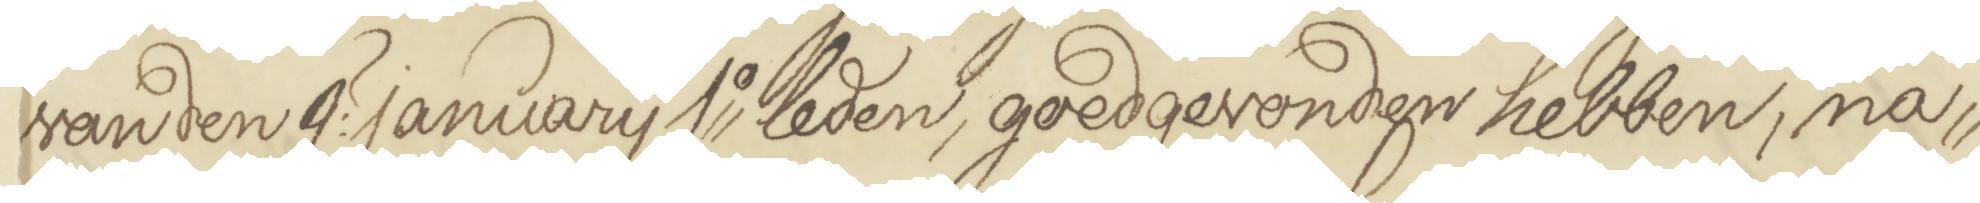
van den 4:' Januarij j„o leden, goedgevonden hebben, na„
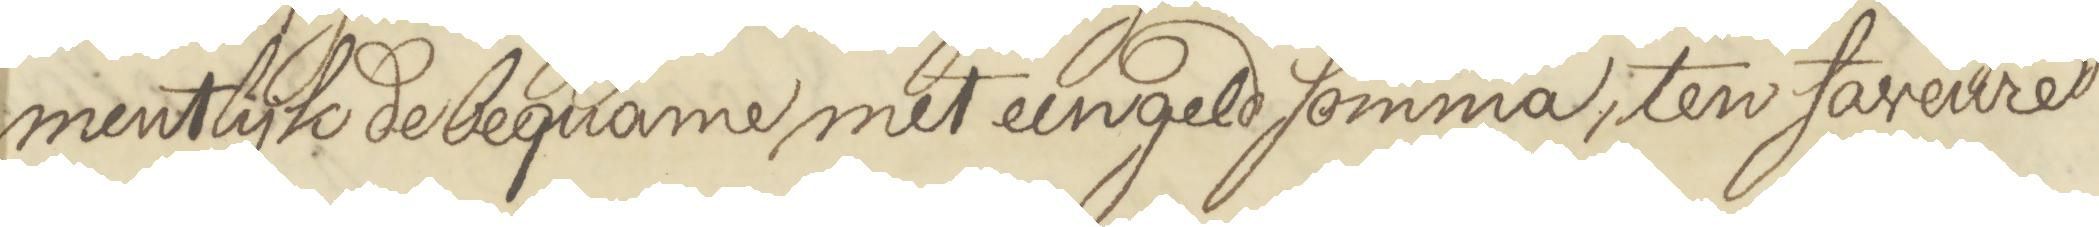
mentlijk de bequame met een geld Somma, ten faveure
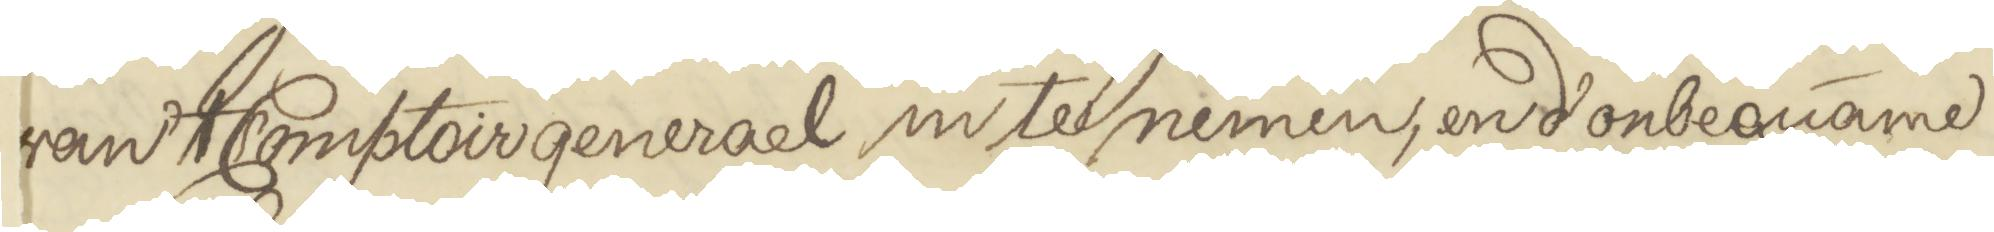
van 't Comptoir generael in te nemen, en d’onbequame
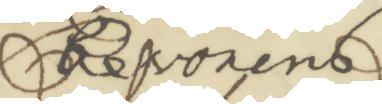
bevorens
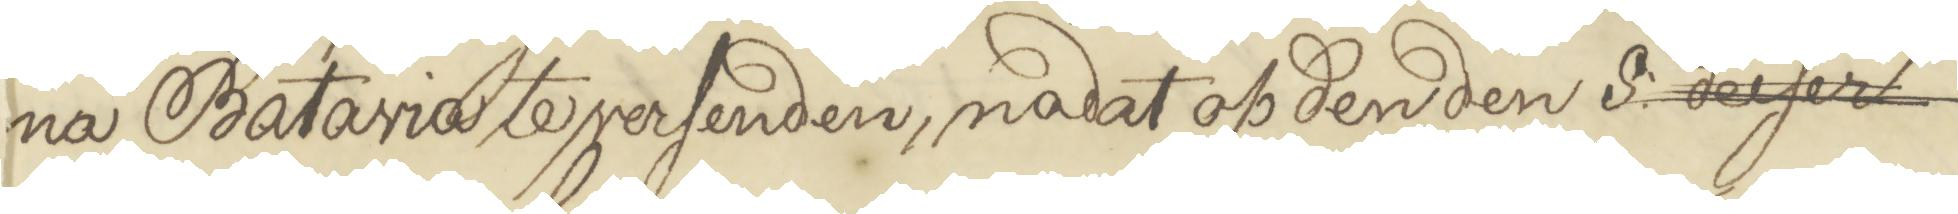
na Batavia te versenden, na dat op den den 5: deesert
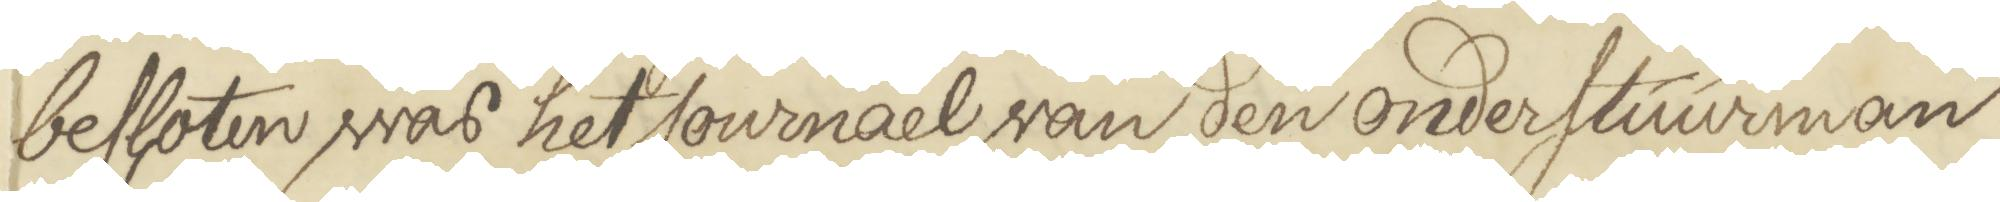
besloten was het journael van den onderstuurman
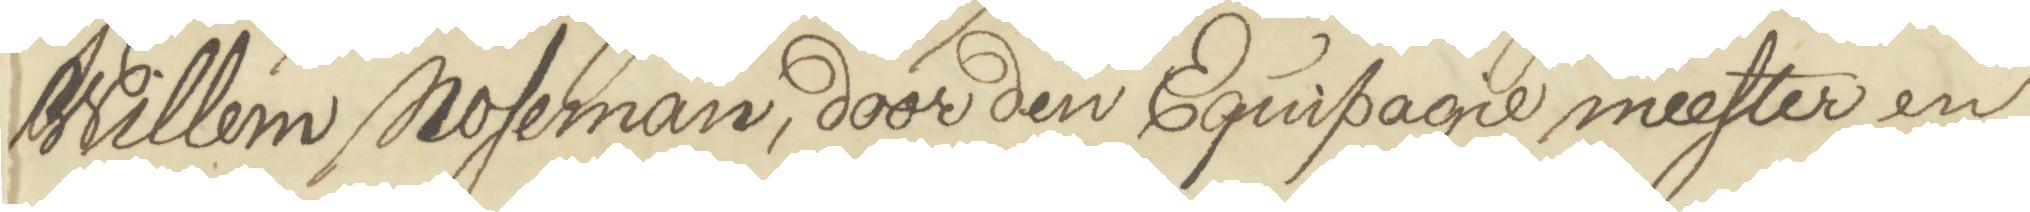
Willem Noseman, door den Equipagie meester en
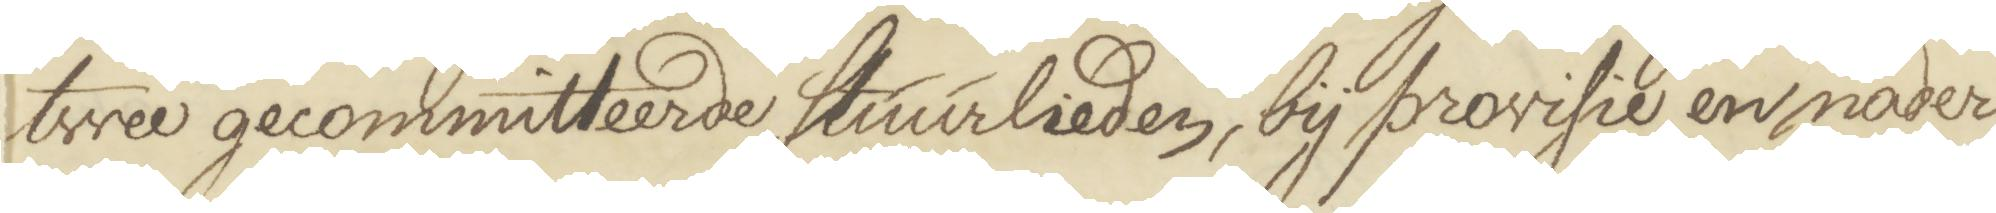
twee gecommitteerde Stuurlieden, bij provisie en nader
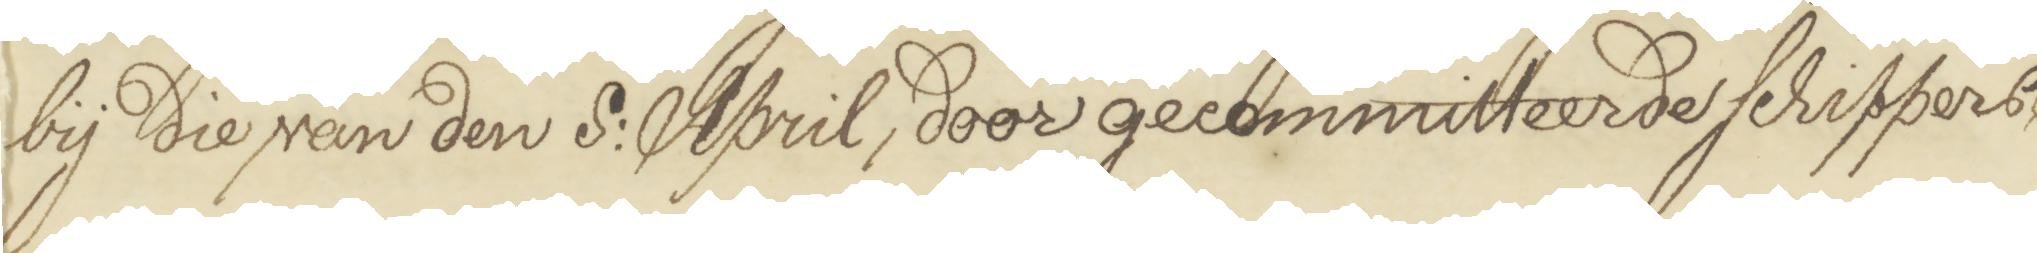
bij die van den 5: April, door gecommitteerde Schippers
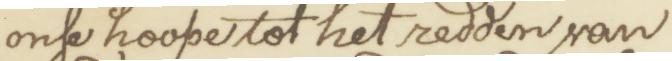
onse hoope tot het redden van
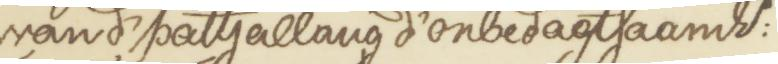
van d’ pattjallang d’onbedagtsaamh:t
